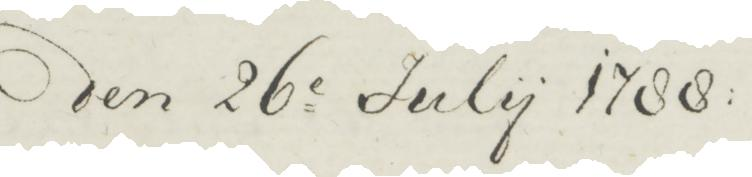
den 26=e Julij 1788:
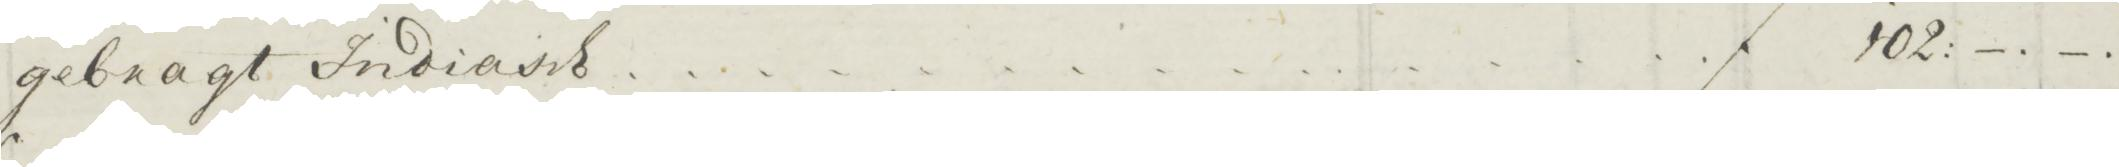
gebragt Indiasch . . . . . . . . . . . . . . . . ƒ 102: —. —.
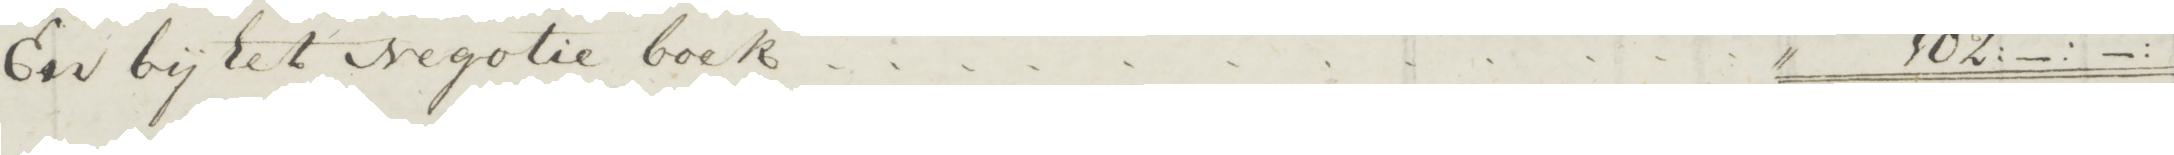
En bij het Negotie boek . . . . . . . . . . . . „ 102: —: —:
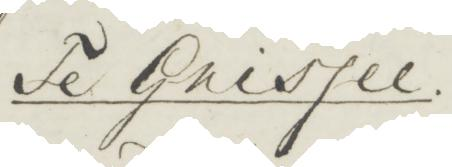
Te Grissee.
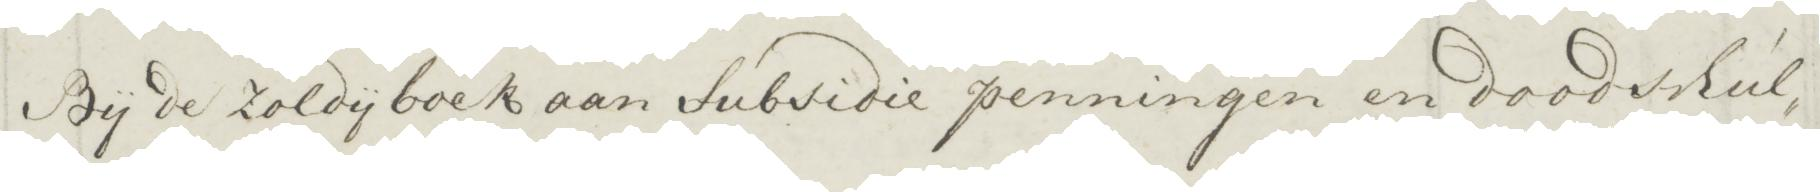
Bij de zoldijboek aan Subsidie penningen en doodschul„
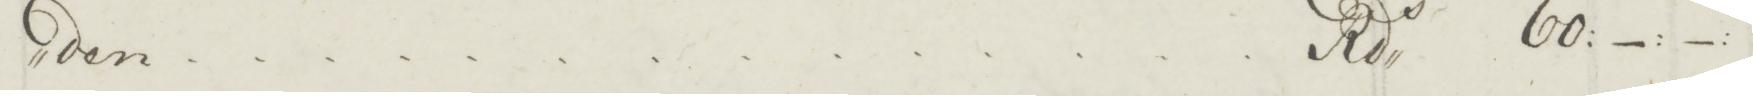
„den . . . . . . . . . . . . . . Rd„s 60: —: —:
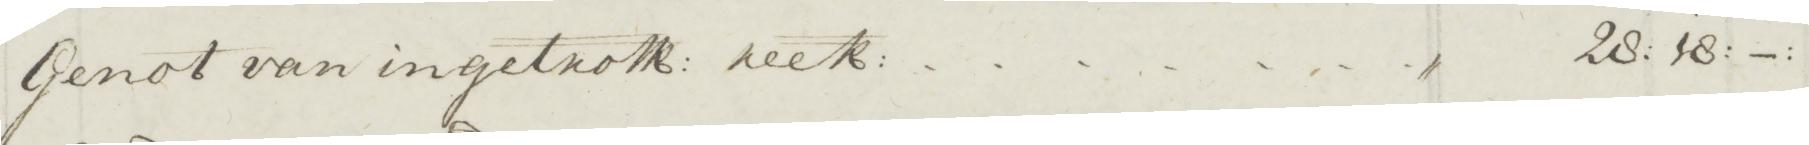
Genot van ingetrokk: reek: . . . . . . . „ 28: 18: —:
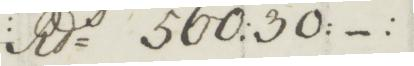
Rd=s 560: 30: —:
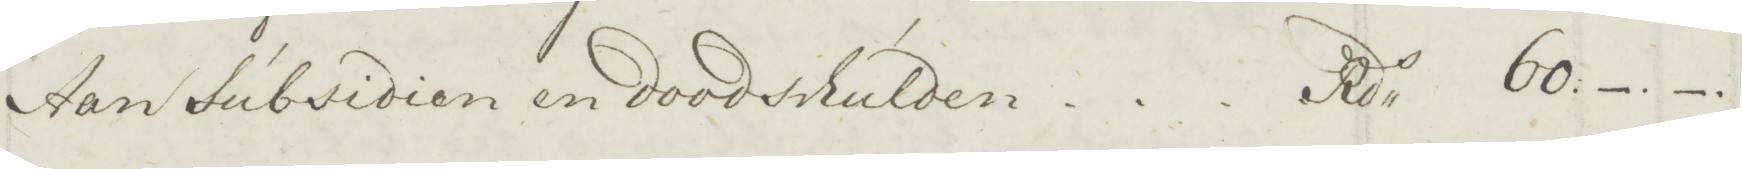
Aan Subsidien en doodschulden . . . Rd„s 60: —. —.
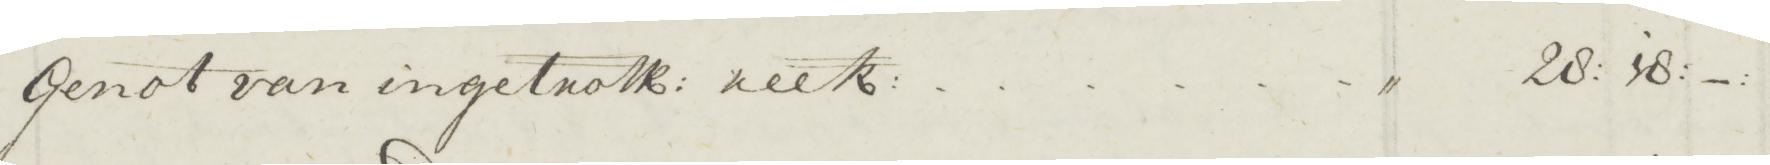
Genot van ingetrokk: reek: . . . . . . „ 28: 18: —:
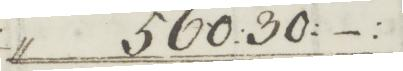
„ 560: 30: —:
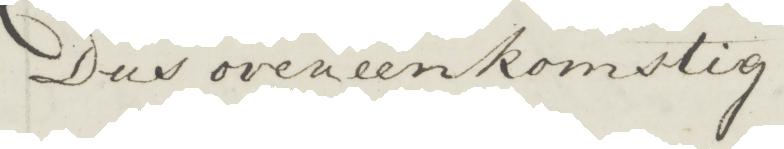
Dus overeenkomstig
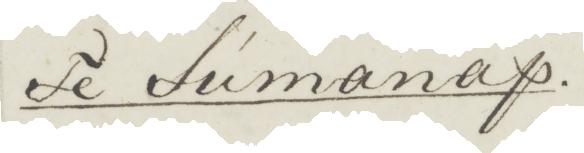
Te Sumanap.
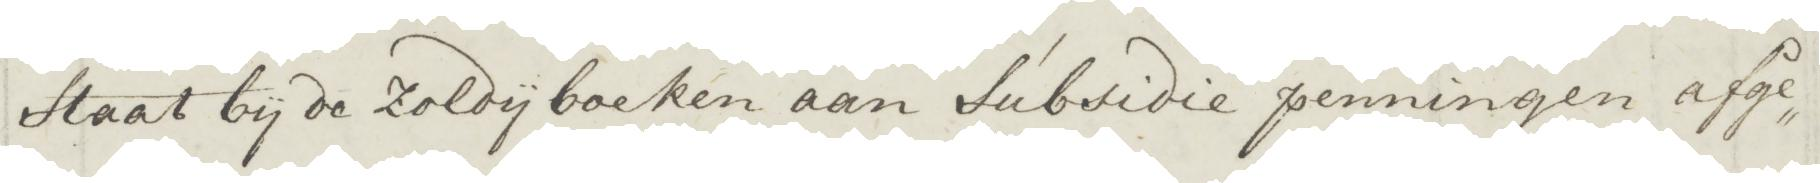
Staat bij de Zoldij boeken aan Subsidie penningen afge„
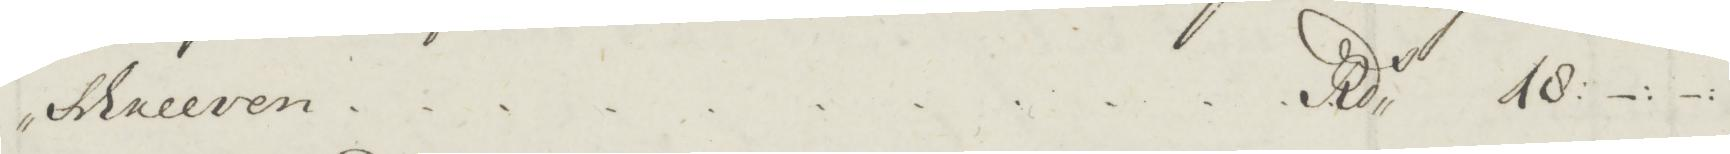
„schreeven . . . . . . . . . . . Rd„s 48: —: —:
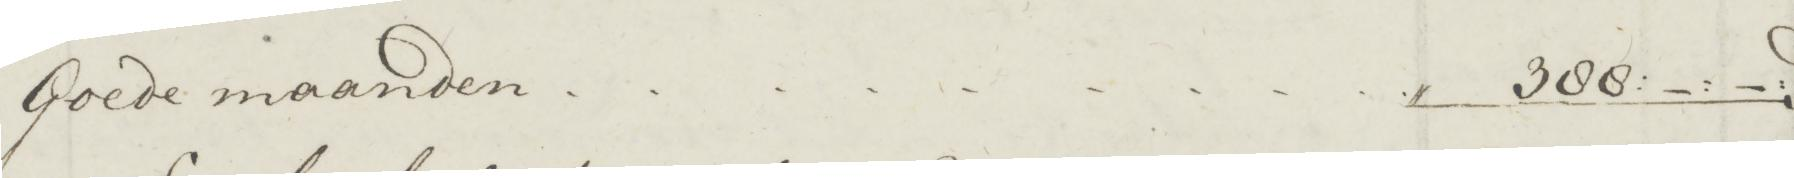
Goede maanden . . . . . . . . . . . „ 388: —: —:
